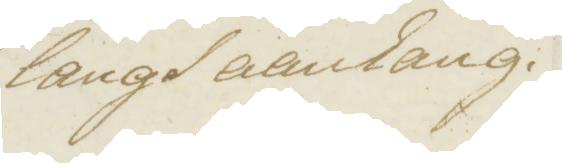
langs aanhang.
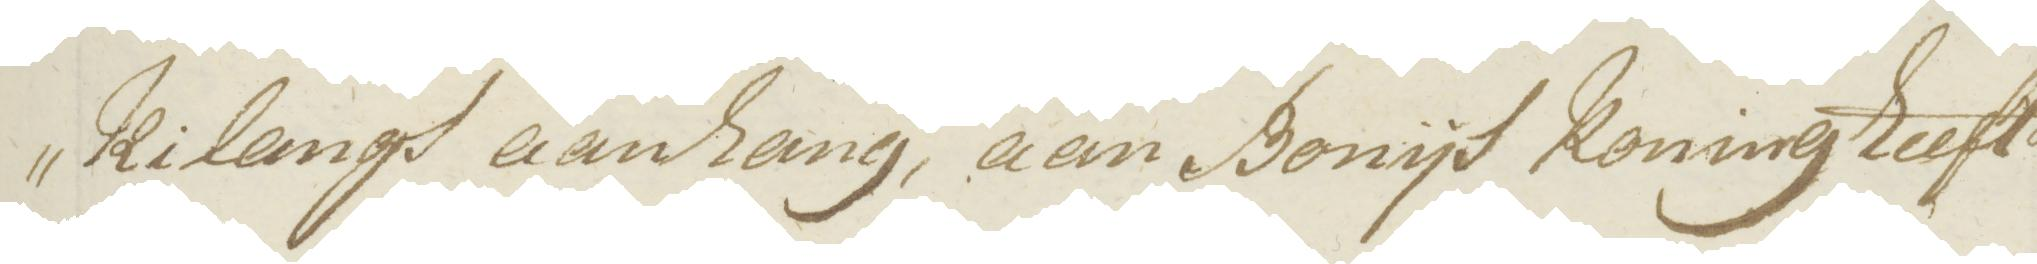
„ kilangs aanhang, aan Bonijs koning heeft
